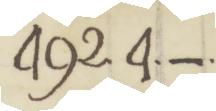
492.4.—.
